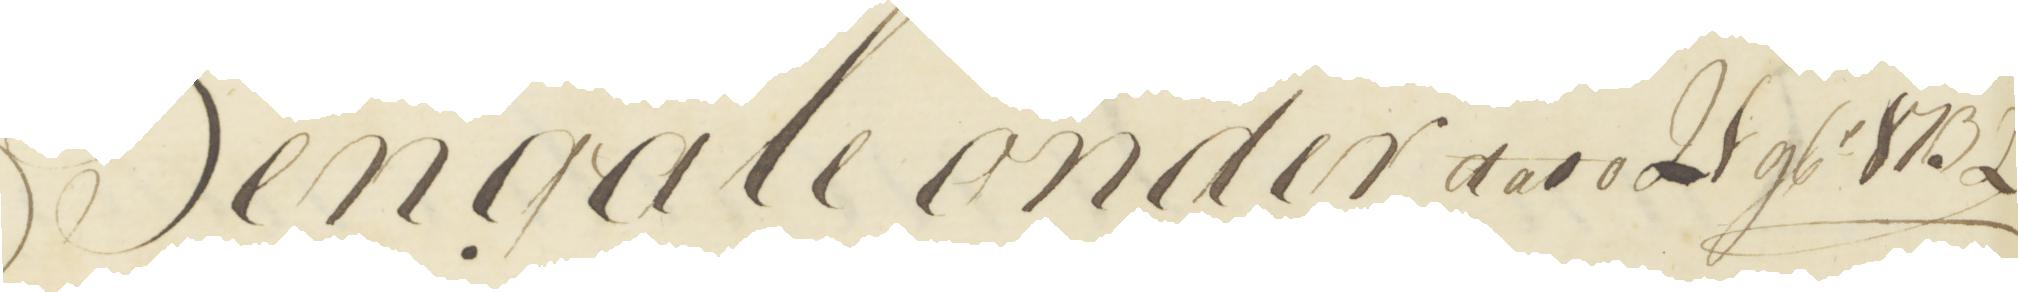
Van Bengale onder dato 21 9„b 1732
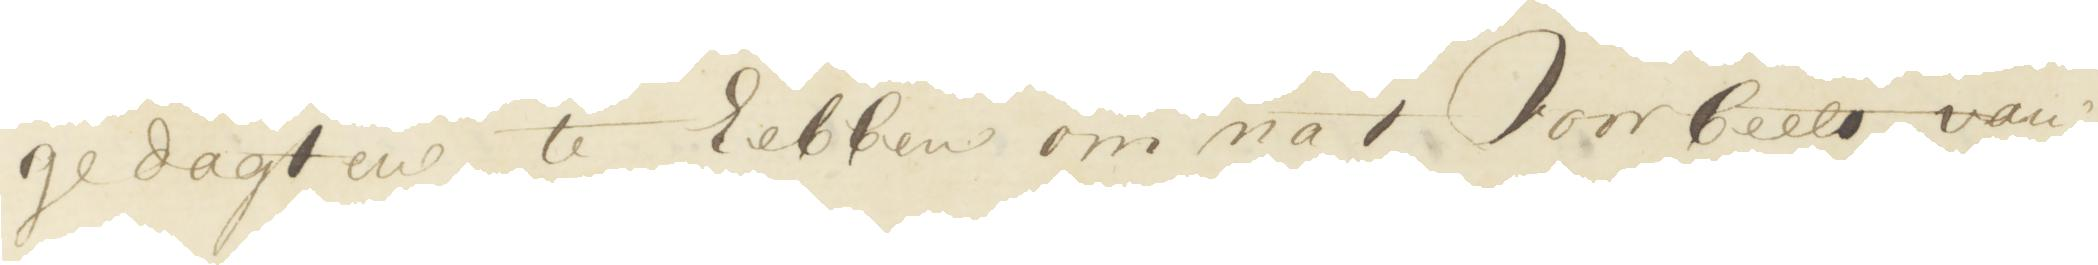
gedagten te hebben om na t Voorbeelt van
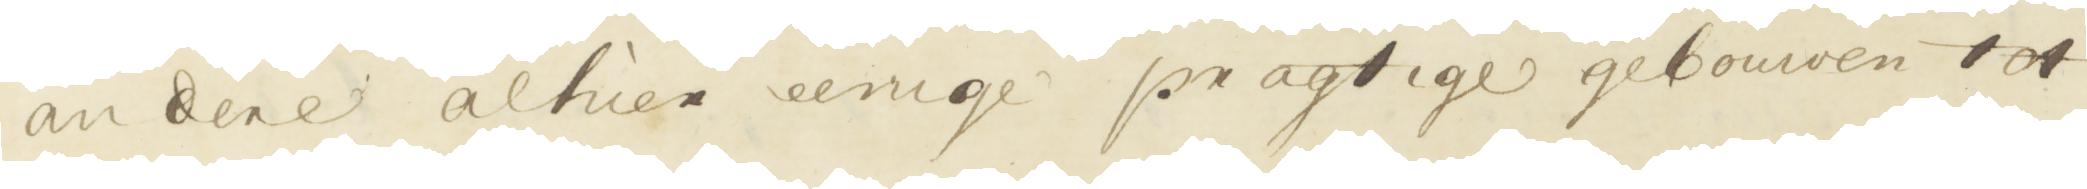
andere alhier eenige pragtige gebouwen tot
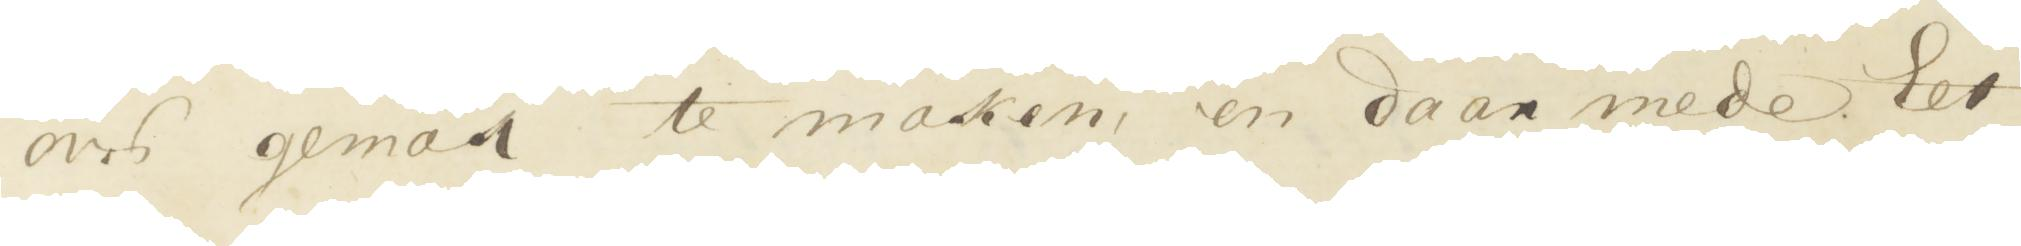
ons gemak te maken, en daar mede het
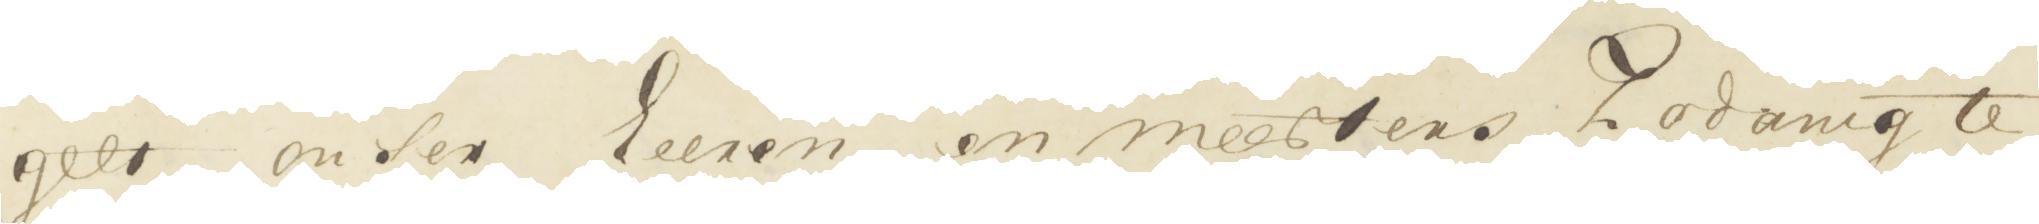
gelt onser heeren en meesters zodanig te
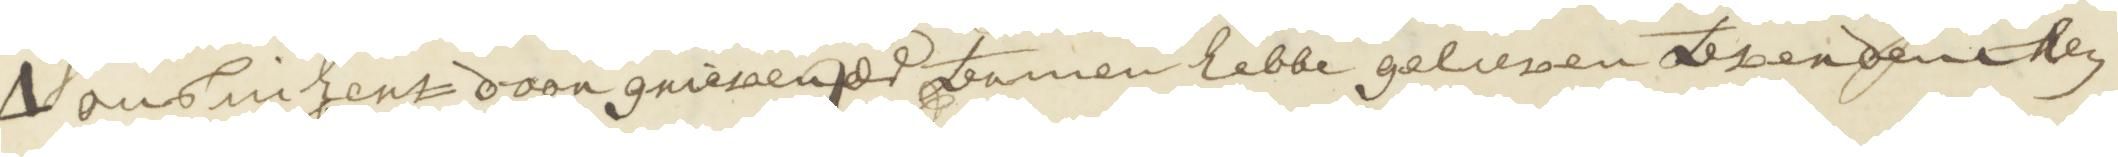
^ons in hert doorgrievende termen hebbe gelieven te verdencken
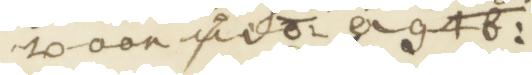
zo aan uEd: agtb:
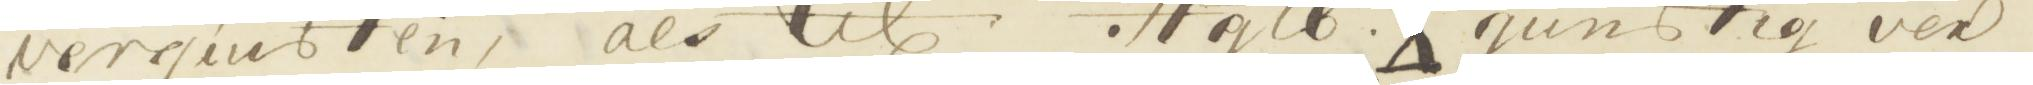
verquisten, als uE: Agtb: ^ gunstig ver
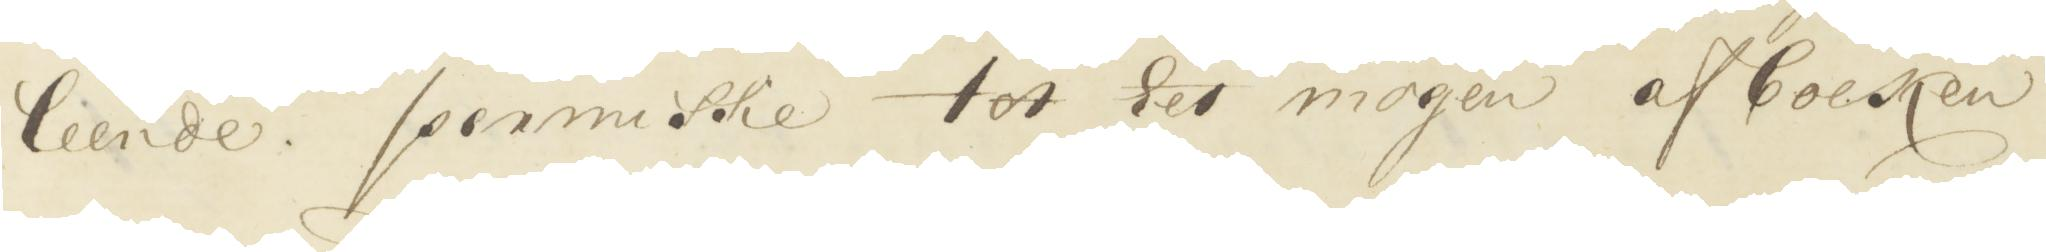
leende. permissie tot het mogen afboeken
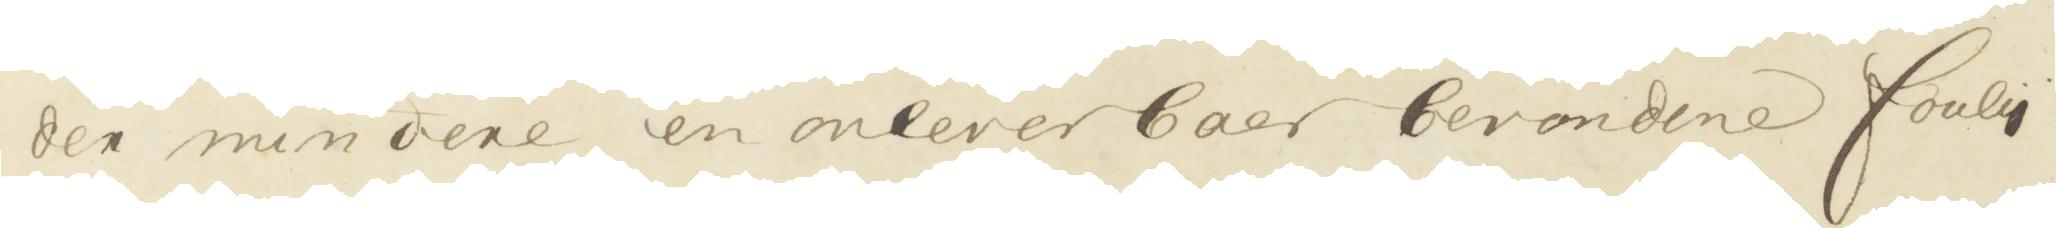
der mindere en onleverbaer bevondene foulij
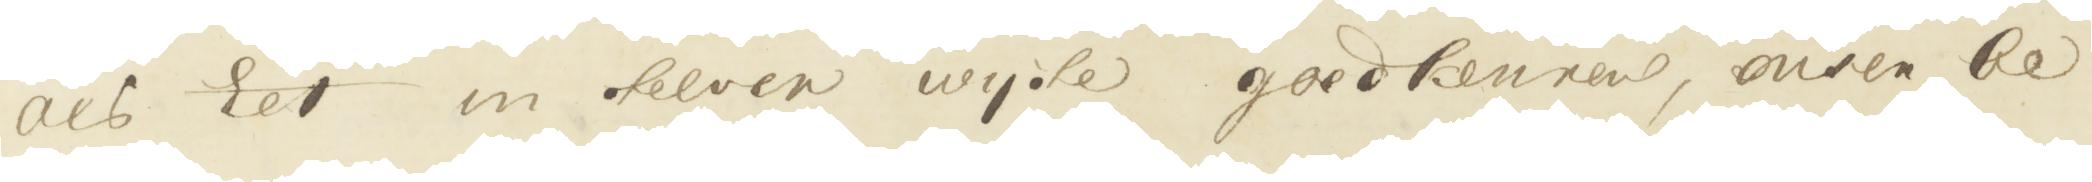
als het in selver wyse goedkeuren, onser be
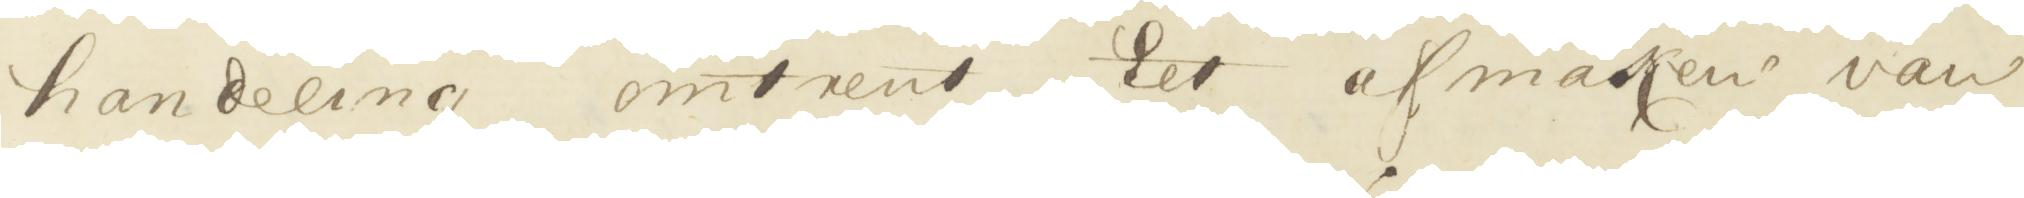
handeling omtrent het afmaken van
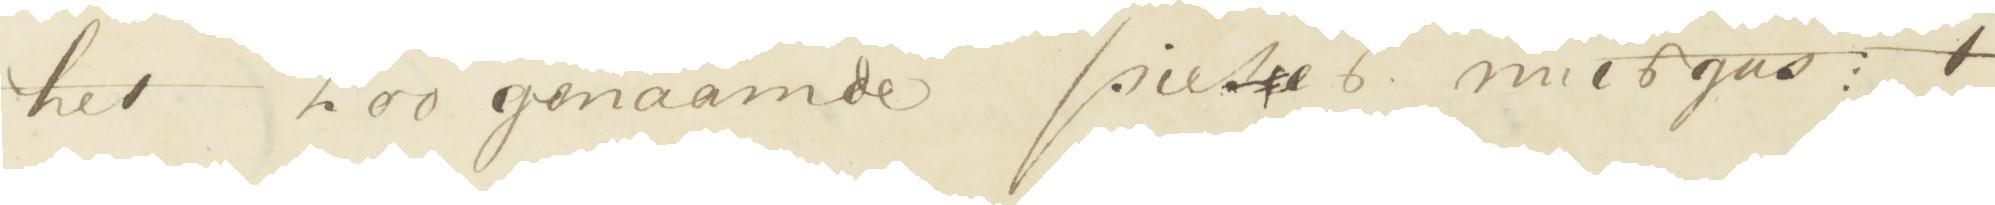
het Zoo genaamde pieties. mitsgrs: t
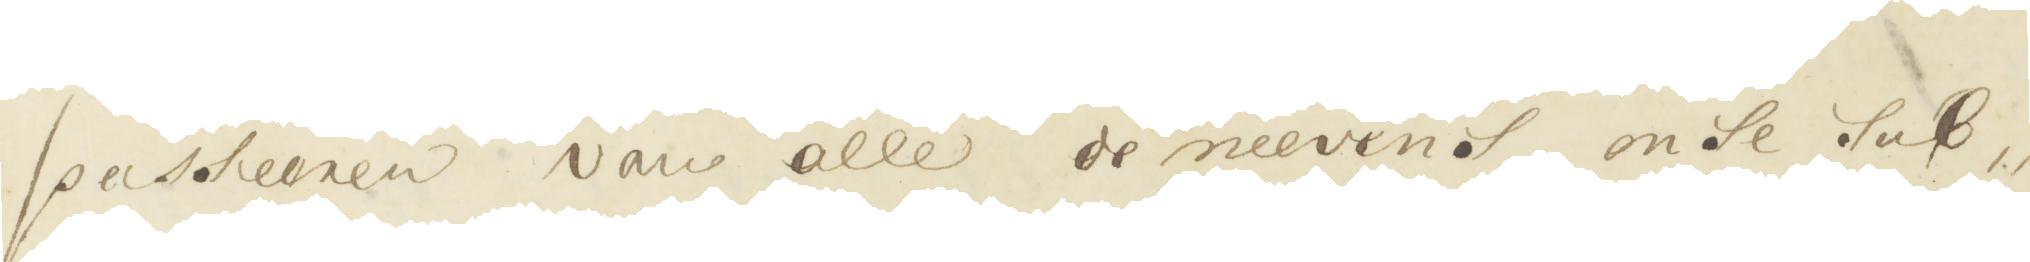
passeeren van alle de neevens onse sub„
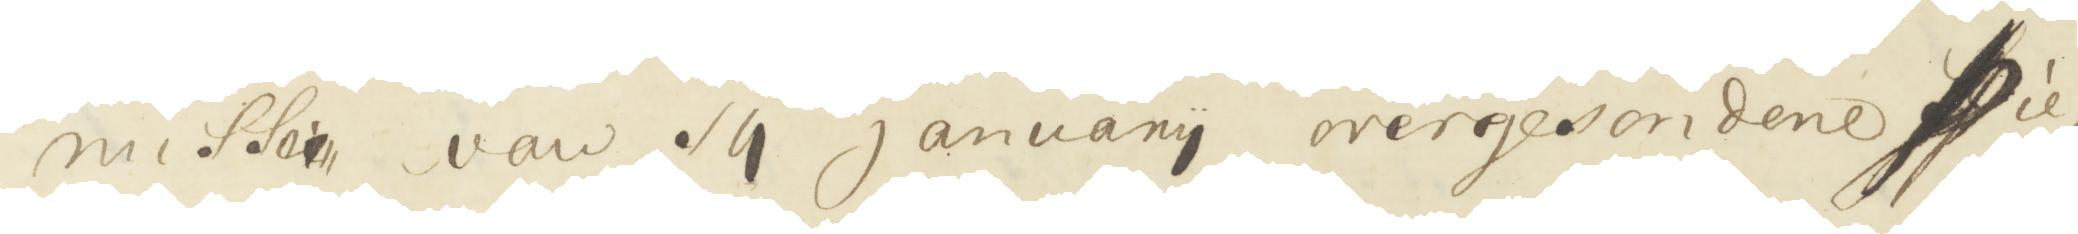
missen van 14 januarij overgesondene ppie
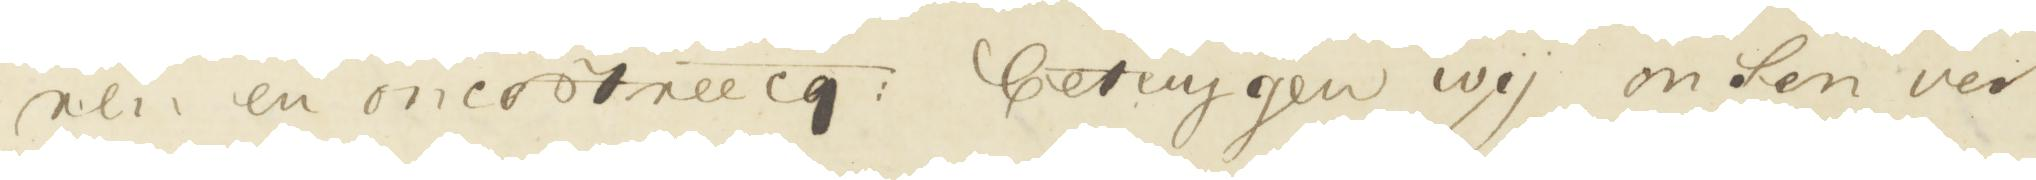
ren en oncost reecq: betuygen wij onsen ver
